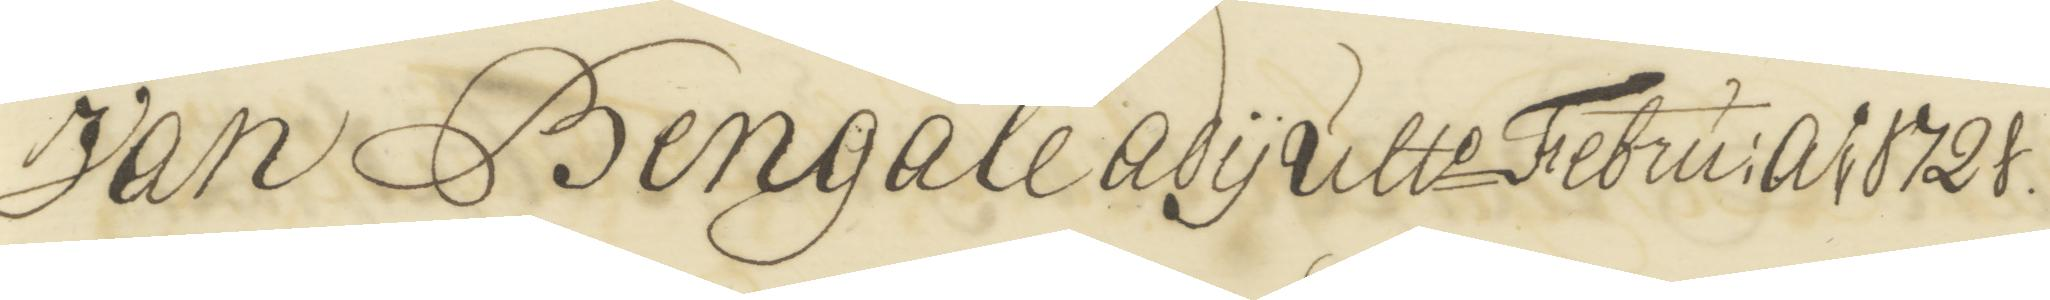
van Bengale adij ult=o Febru: a„o 1721.
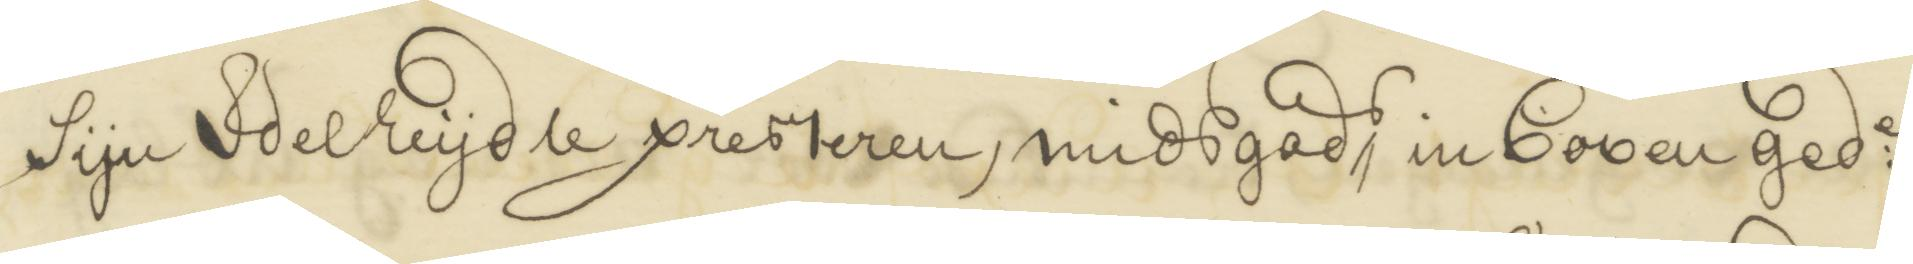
sijn Edelheijd te presteren, midsgad„s in boven ged:e
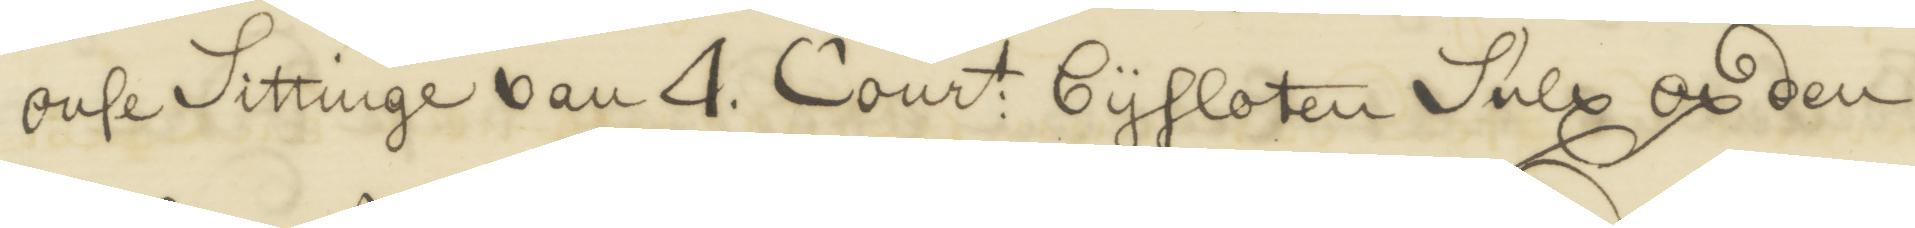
onse Sittinge van 4. Cour:t bijsloten sulx op den
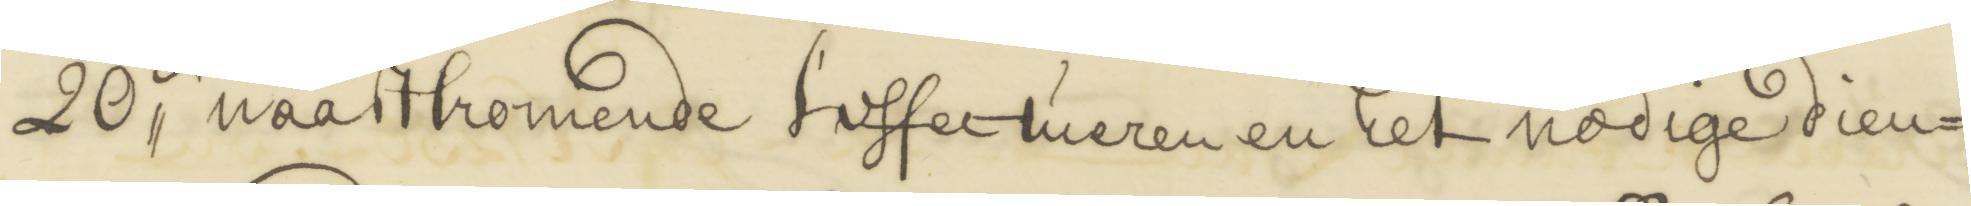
20„' naastkomende t'effectueren en het nodige dien=
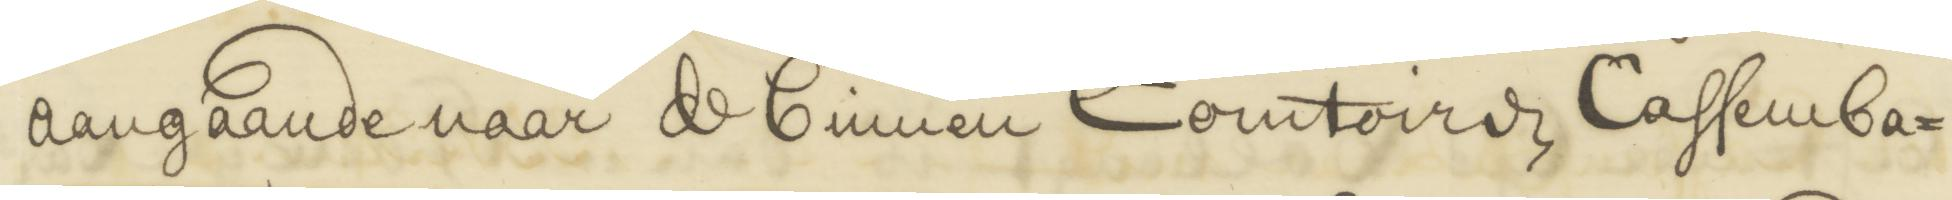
aangaande naar de binnen Comtoiren Cassemba=
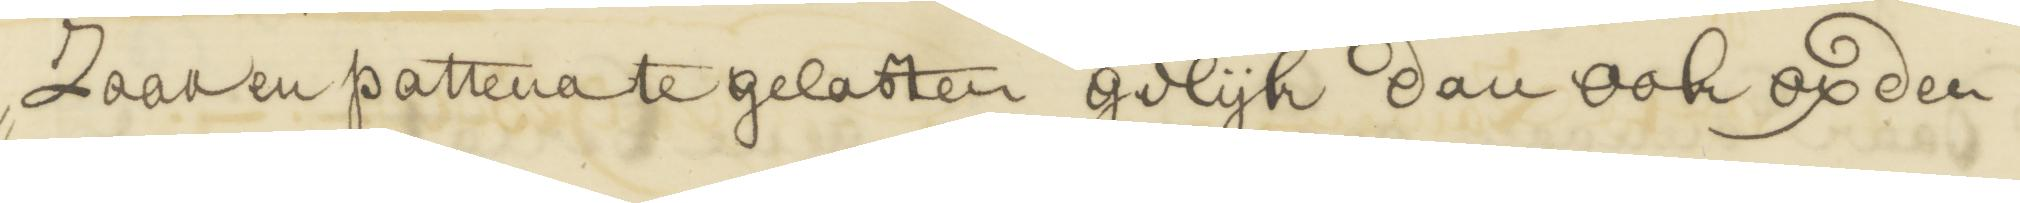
„zaar en pattena te gelasten gelijk dan ook op den
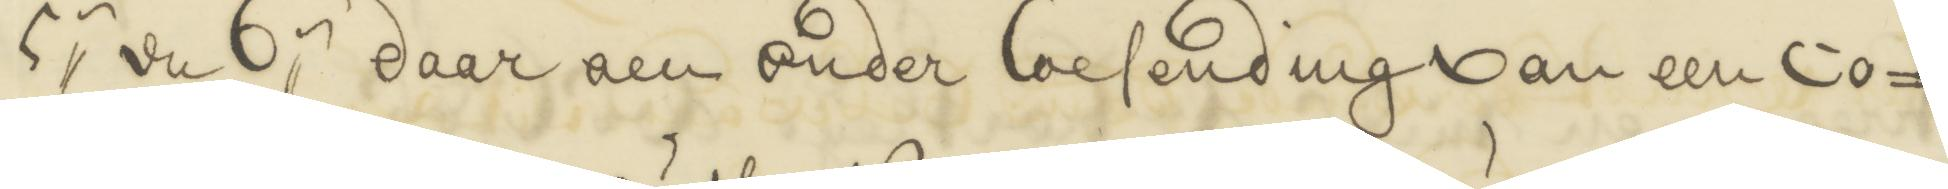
5„' en 6„' daar aen onder toesending van een co=
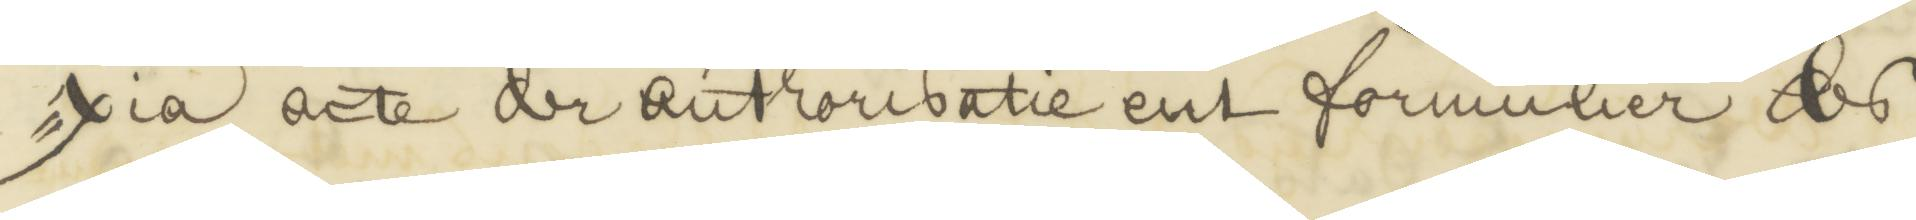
„pia acte der authorisatie ent formulier des
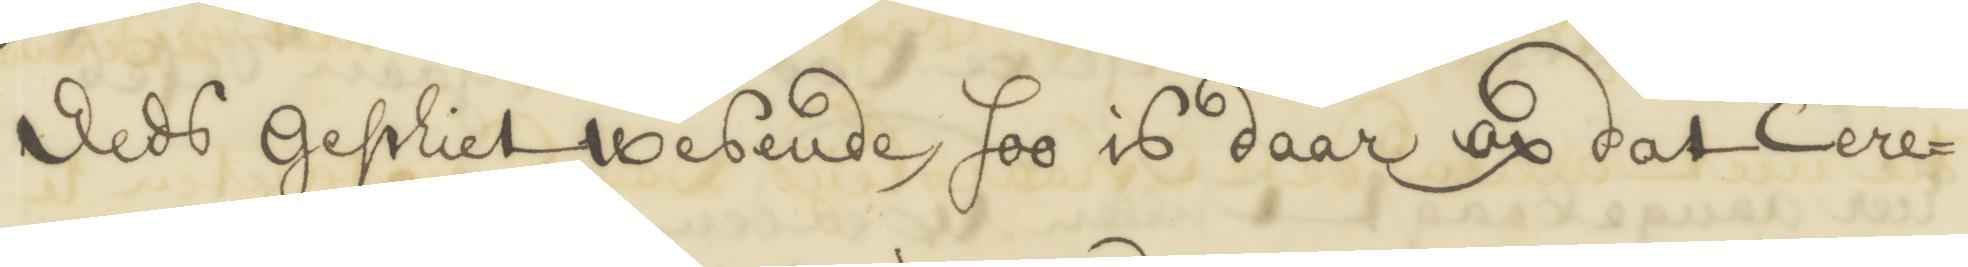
Eeds geschiet wesende, soo is daar op dat Cere
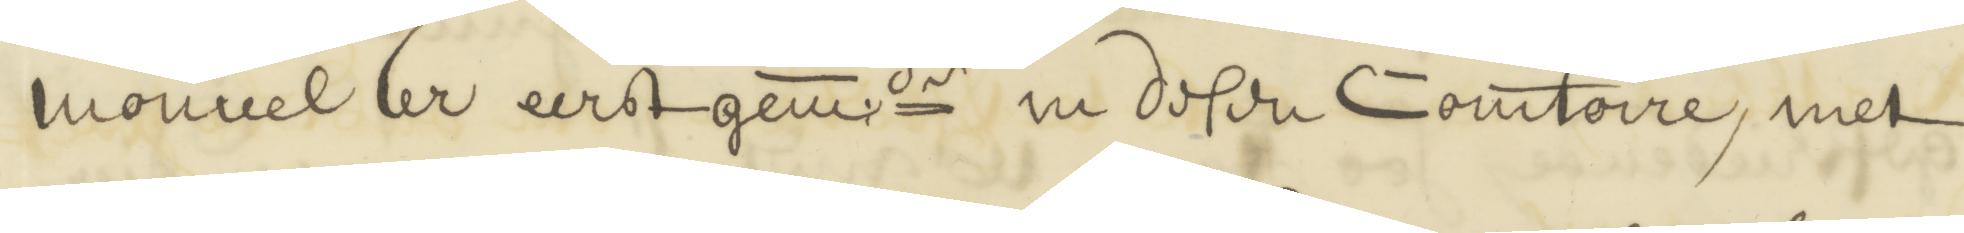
monieel ter eerst gem:=de in desen Comtoire, met
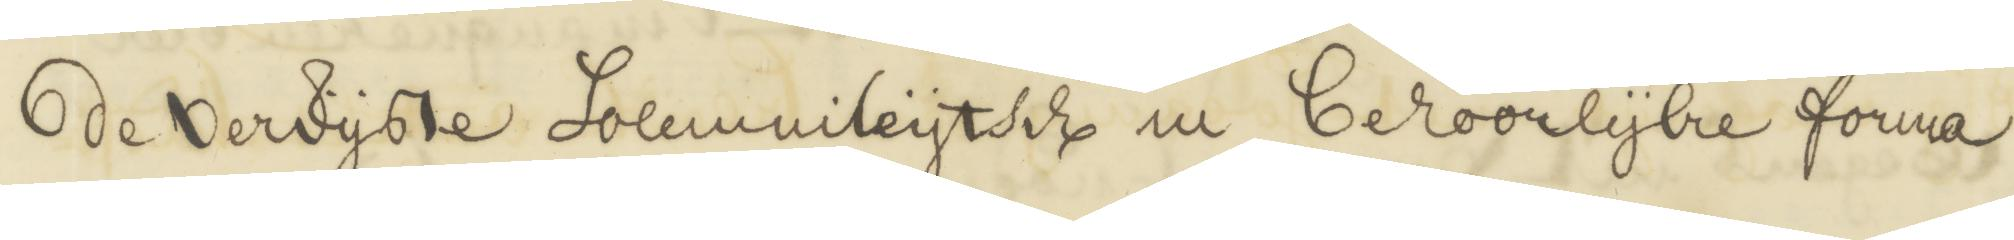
de vereijste solemniteijtsch in behoorlijke forma
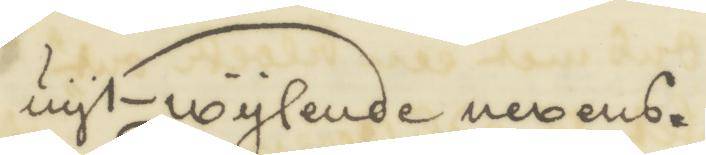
uijt wijlende nevens=
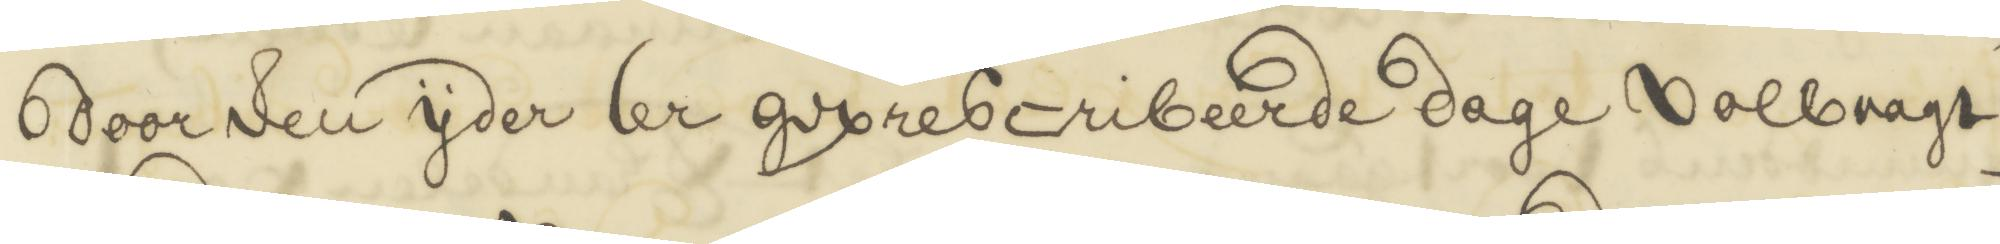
door een ijder ter geprescribeerde dage volbragt
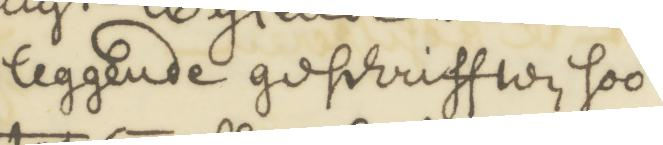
leggende geschrifften soo
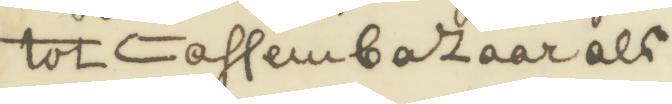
tot Cassembazaar als
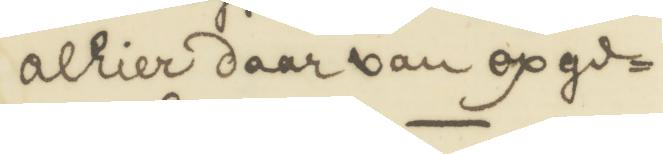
alhier daar van opge=
